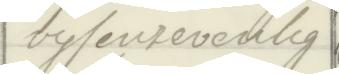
vyf enzeventig
